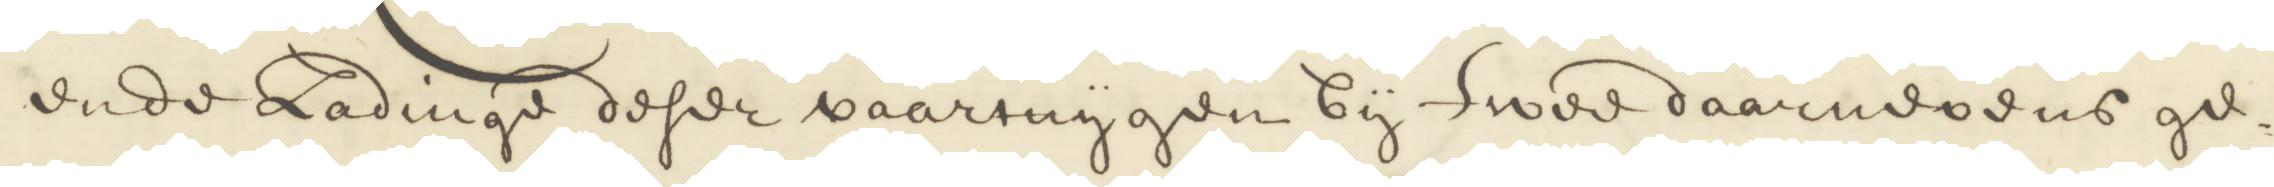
ende ladinge deser vaartuijgen bij twee daarnevens ge=
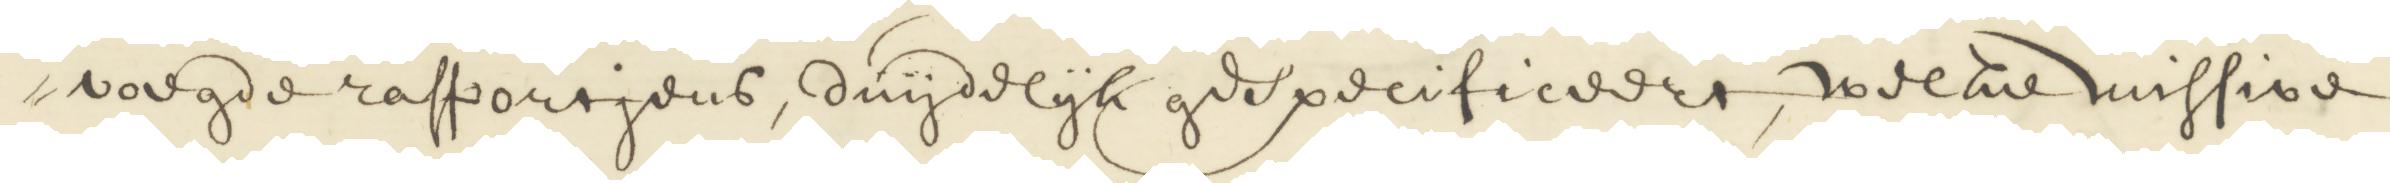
„voegde rapportjens, duijdelijk gespecificeert, welke missive
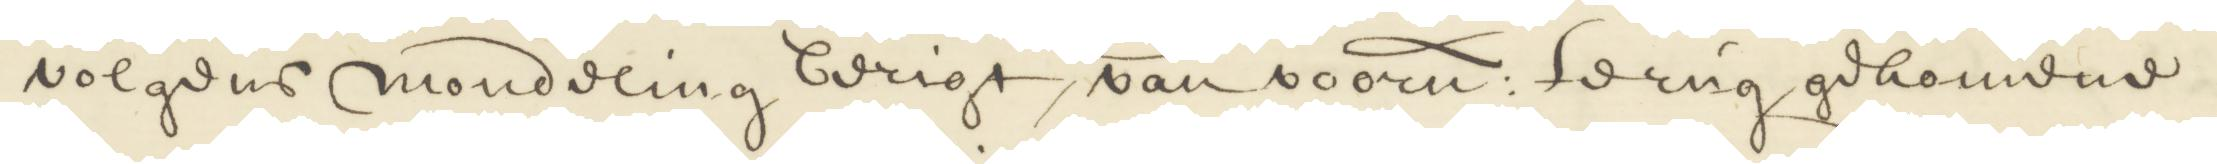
volgens mondeling berigt, van voorn: terug gekomene
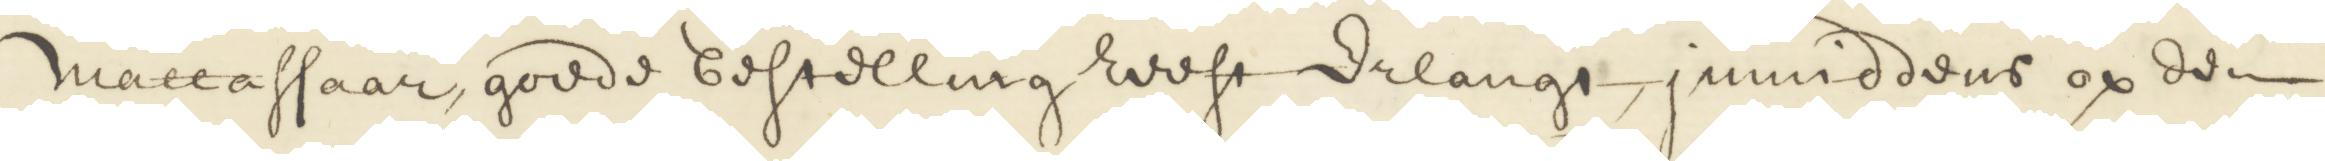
maccassaar, goede bestelling heeft Erlangt, jnmiddens op den
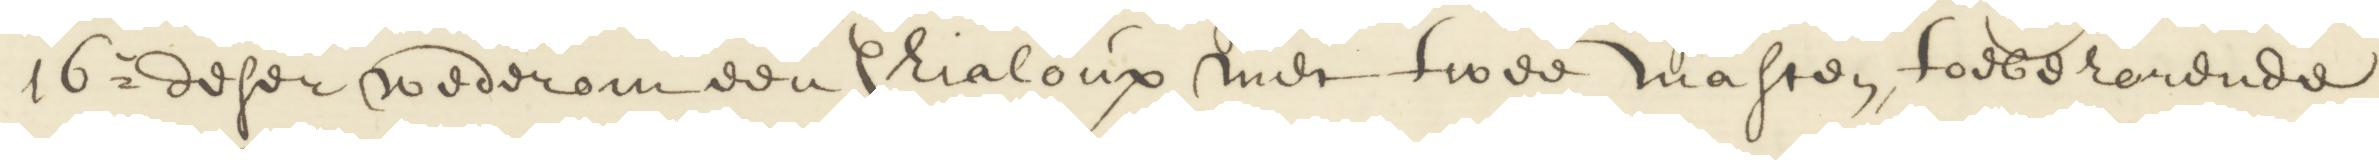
16=e deser wederom een Chialoup met twee masten, toebehorende
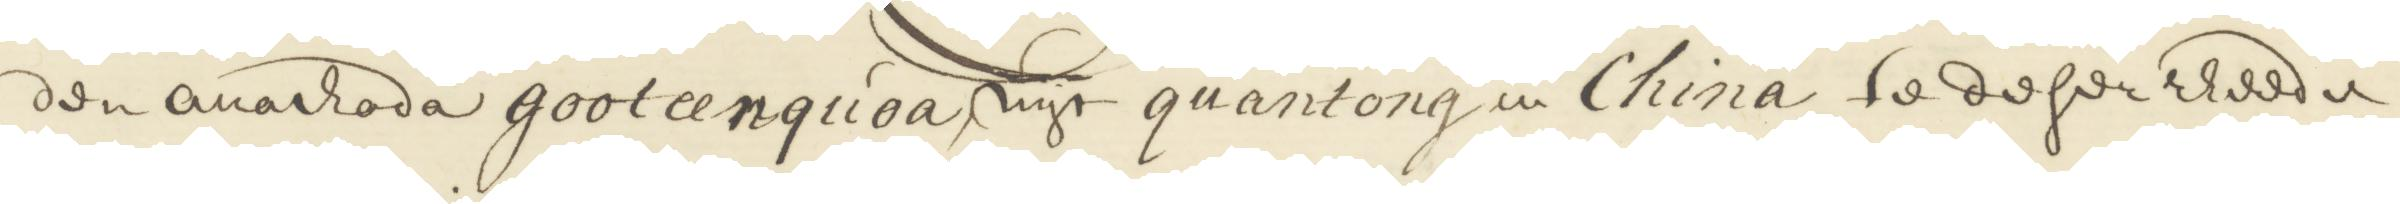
den anachoda gooteenquoa, uijt quantong in China te deser rheede
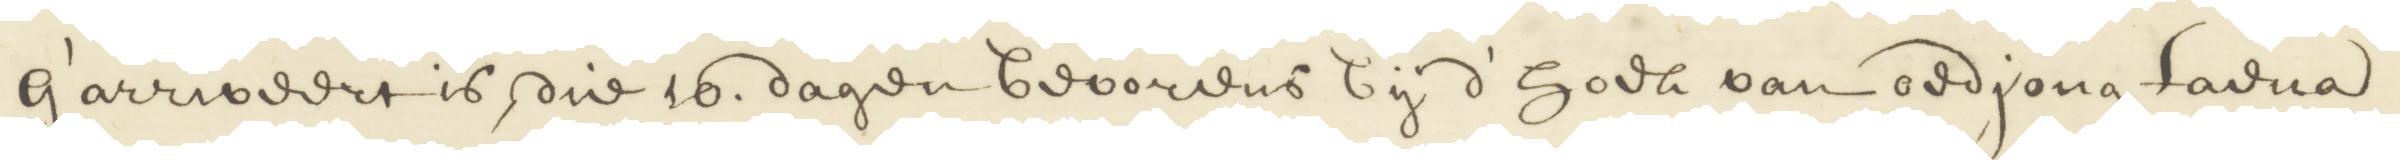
g’arriveert is, die 10. dagen bevorens bij d’ hoek van oedjong taena
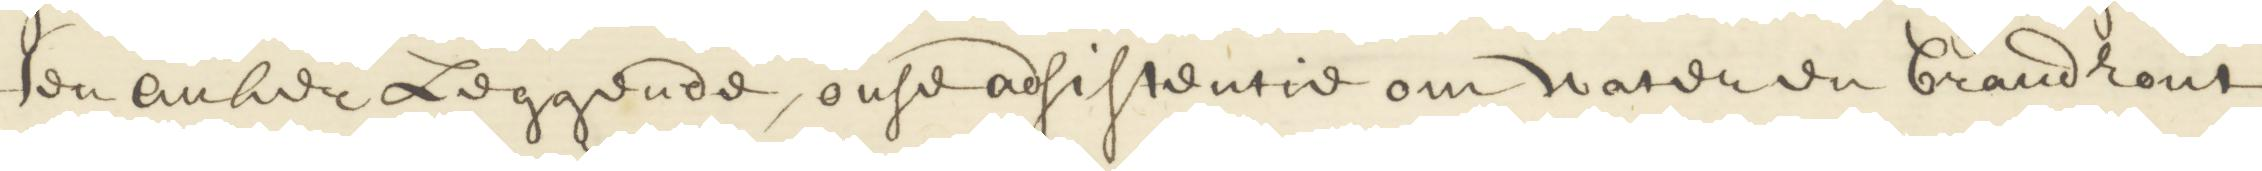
ten anker leggende, onse adsistentie om water en brandhout
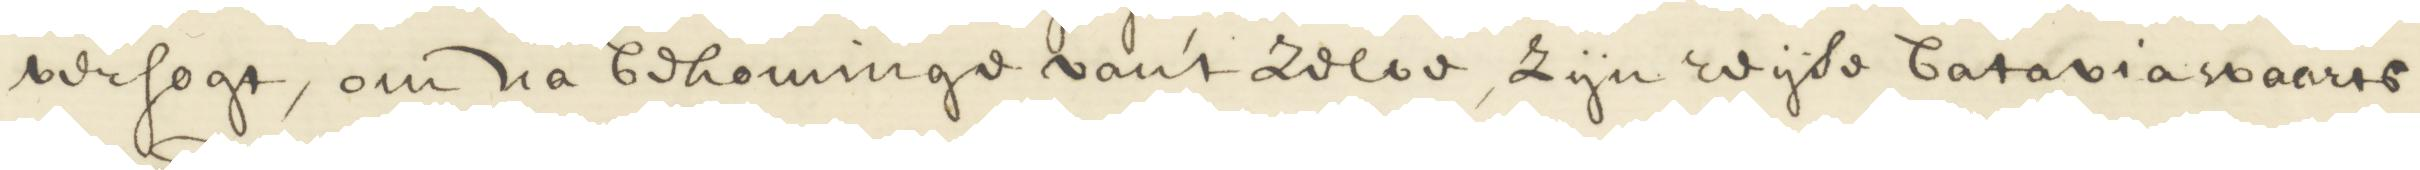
versogt, om na bekominge van’t zelve, zijn reijse batavia waarts
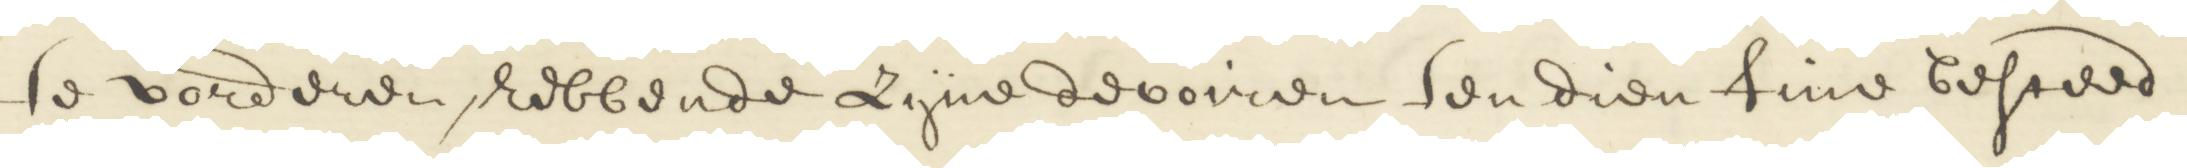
te vorderen, hebbende zijne devoiren ten dien fine besteed
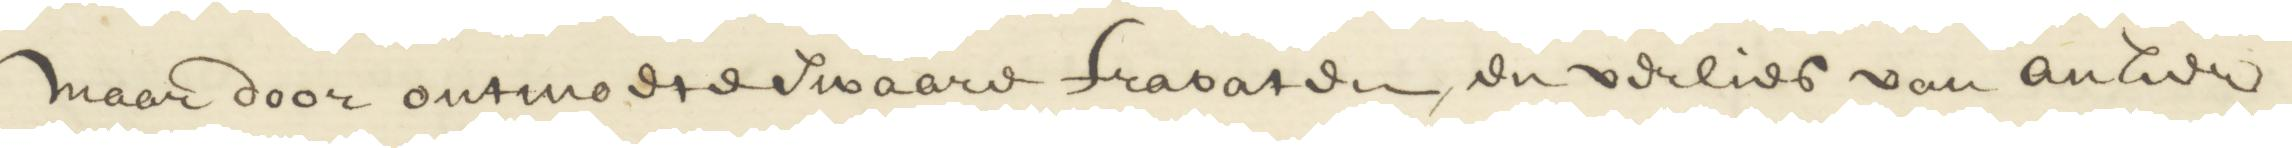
maar door ontmoete swaare travaten, en verlies van anker
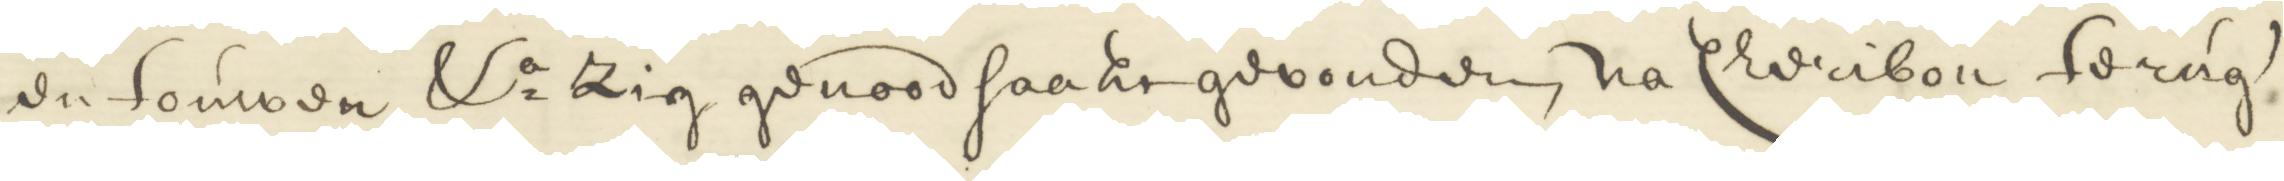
en touwen &=o zig genood saakt gevonden, na Cheribon terug
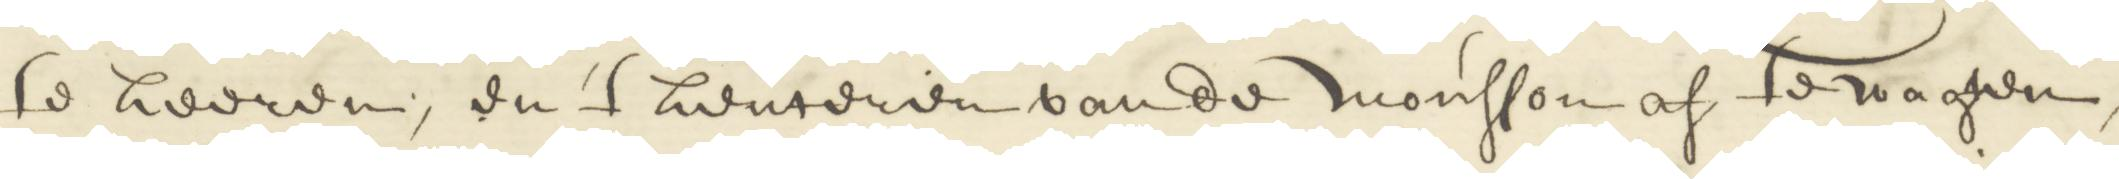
te keeren, en ’t kenteren van de mousson af te wagten
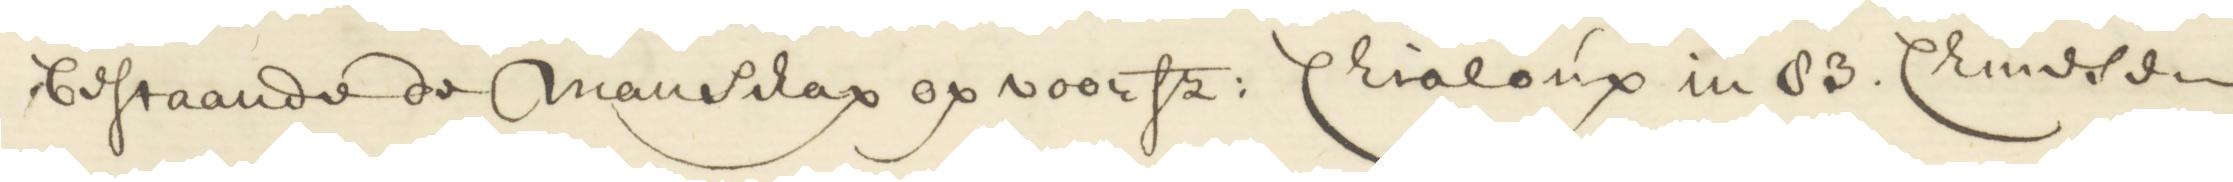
bestaande de manschap op voorsz: Chialoup in 83. Chinesen
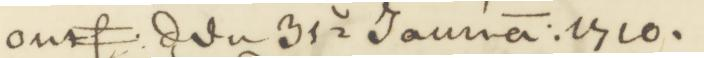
ontf: den 31=e Janua: 1710.
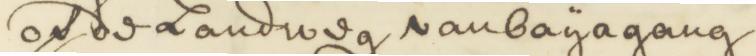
over de Landweg van baijagang
